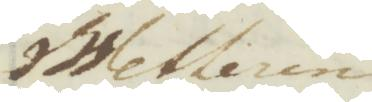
VWetteren
